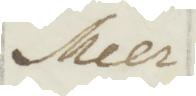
Meer
